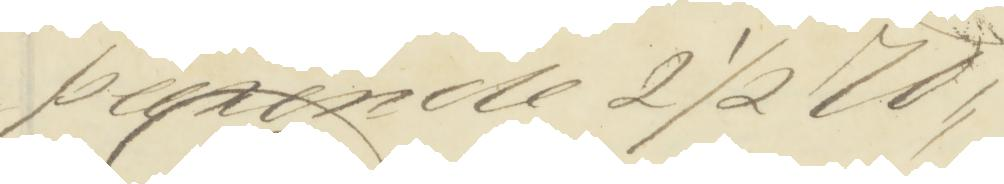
„perende 2½ rd„s
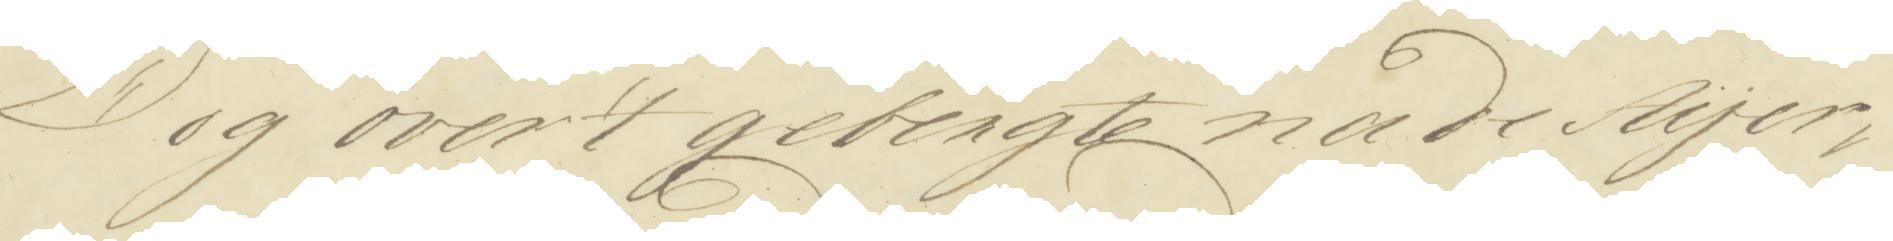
Dog over ’t gebergt na de Aijer=
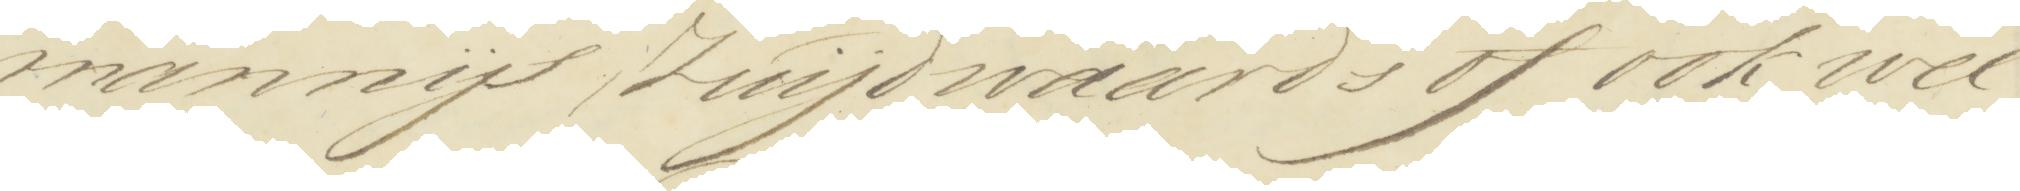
mannijs Zuijd waards of ook wel
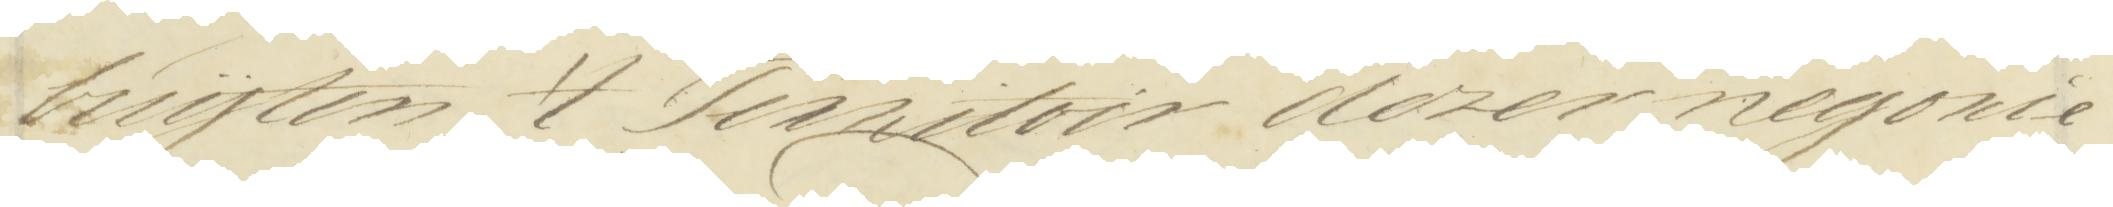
buijten ’t Territoir dezer negorie
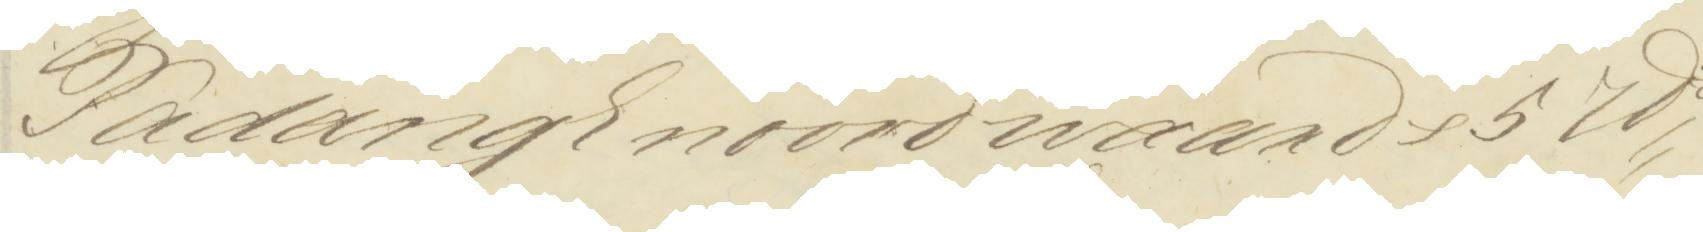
Padangh noord waards 5rd„s
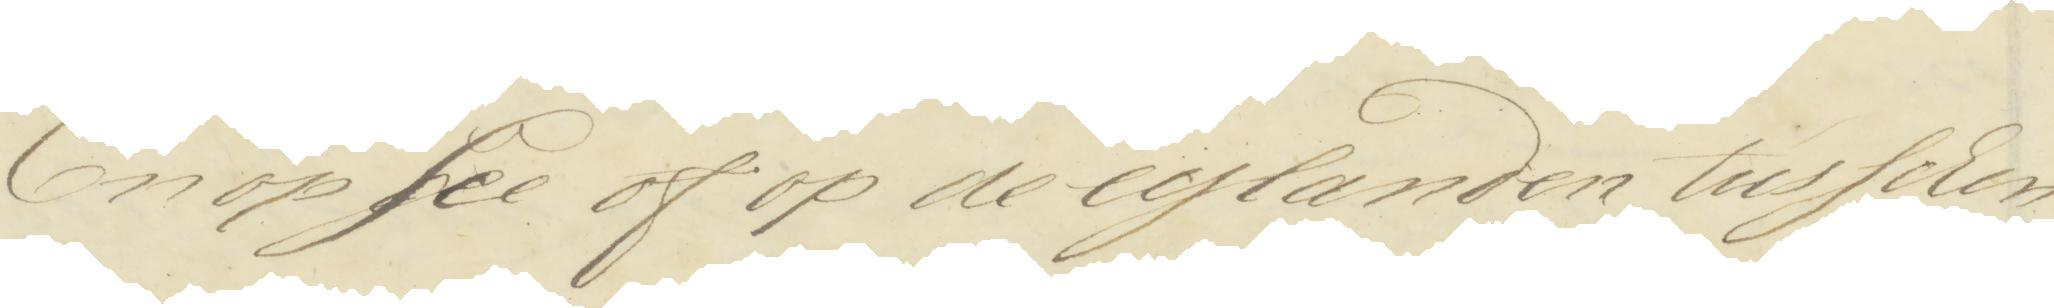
En op See of op de eylanden tusschen
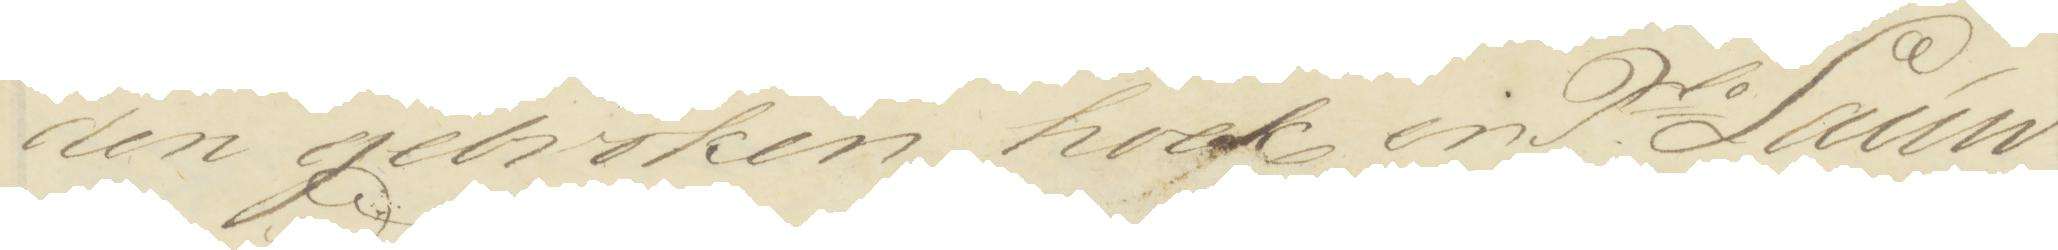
den gebroken hoek en P:lo Lauw
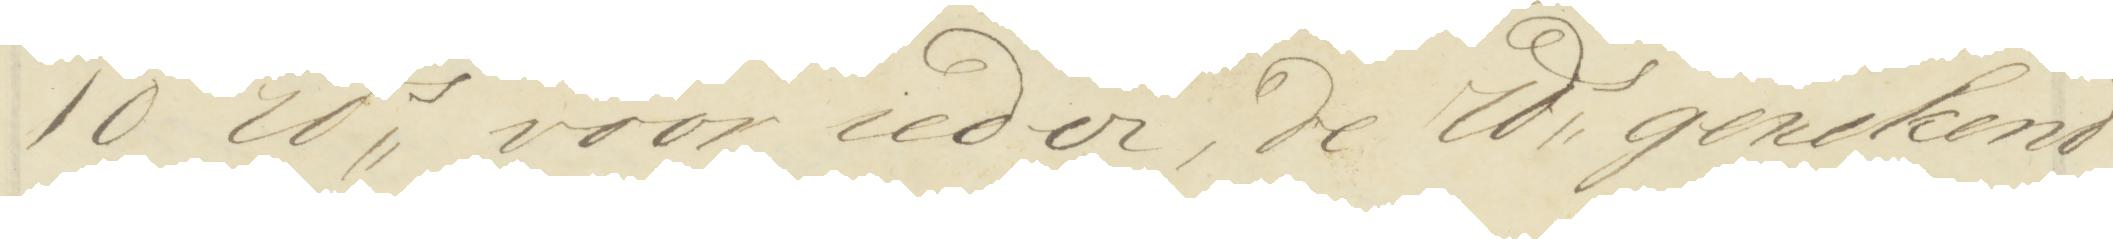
10 rd„s voor ieder de rd:s gerekend
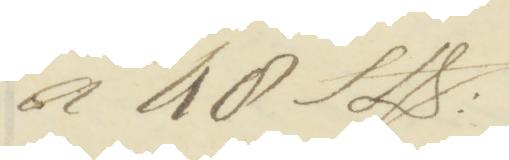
a 48 stver:
